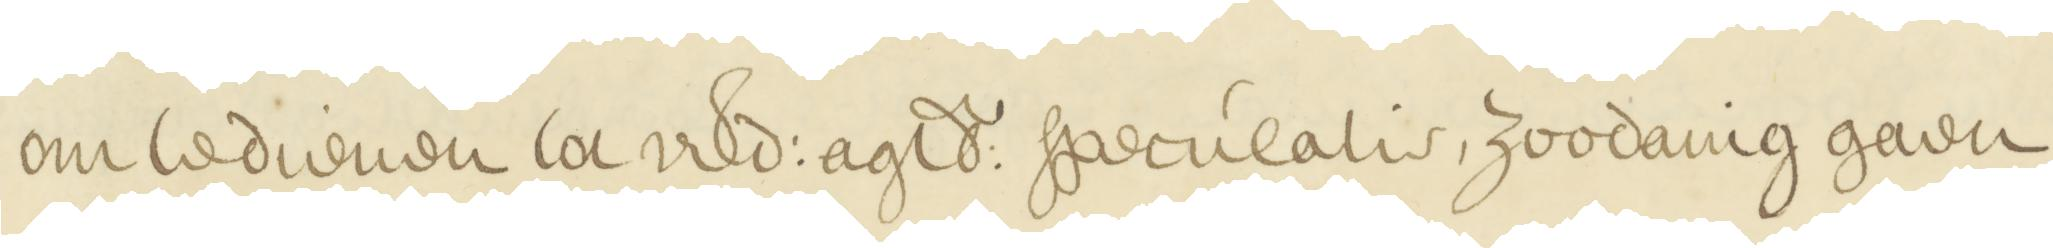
om tedienen tot uEd: agtb:e speculatie, zoodanig gaen
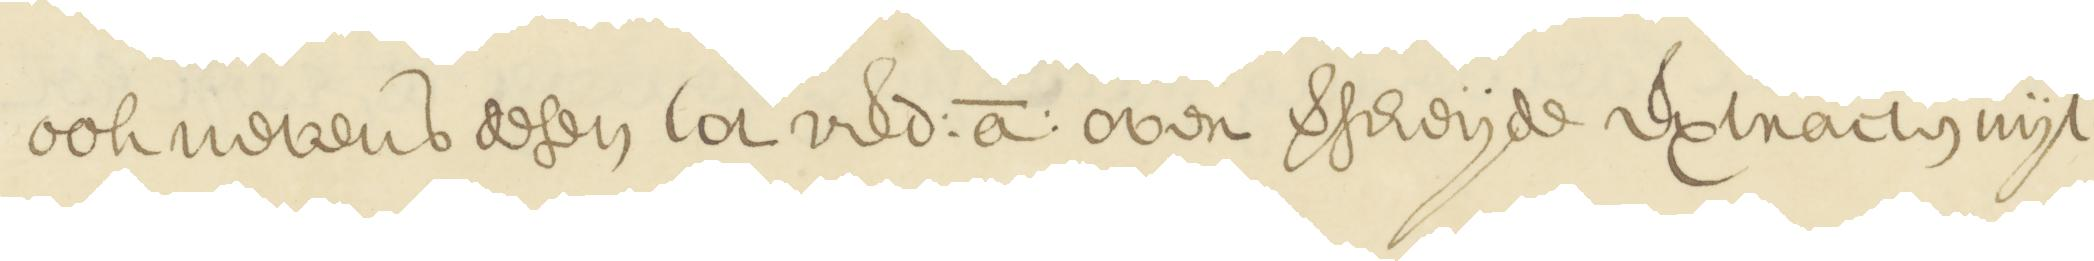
ook nevens desen tot vEd: a: over verscheijde Extracten uijt
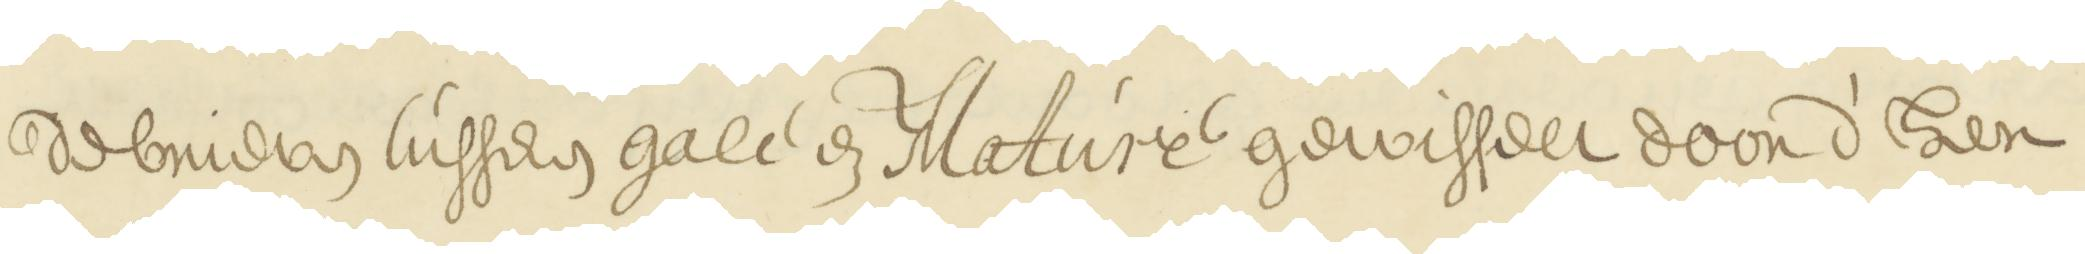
de brieven tusschen gale en Mature gewisselt door d’ heer
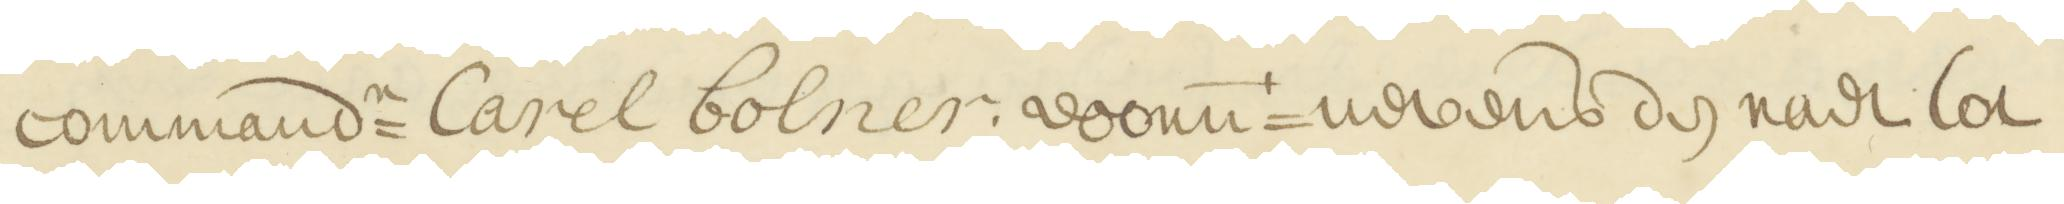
command=r Carel bolner: voorn=t nevens den raet tot
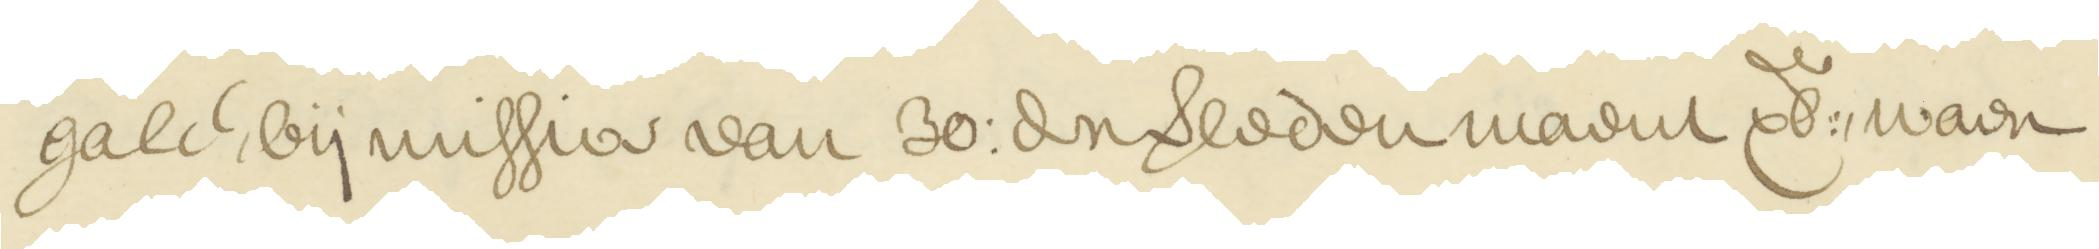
gale, bij missive van 30: derverleden maent xb:, waer
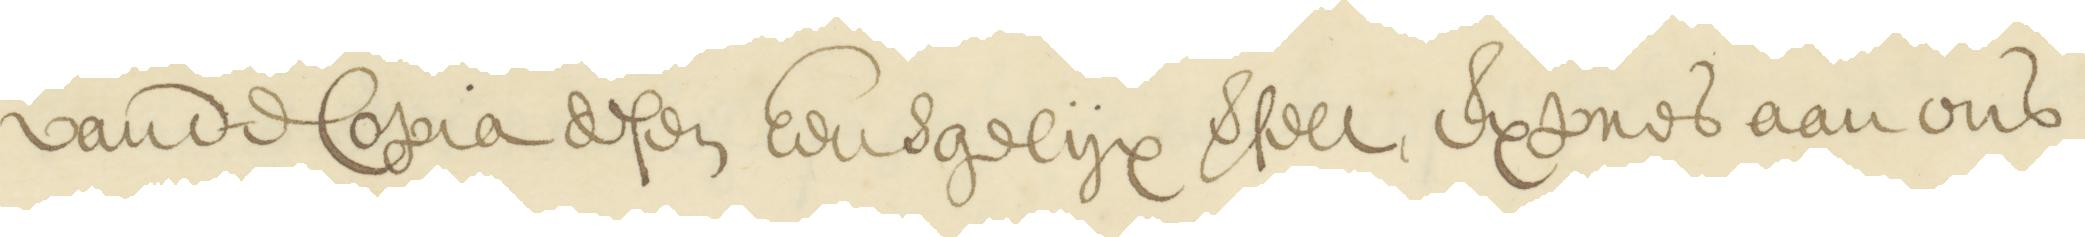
vandeCopia desen Eensgelijx verselt, Expres aan ons
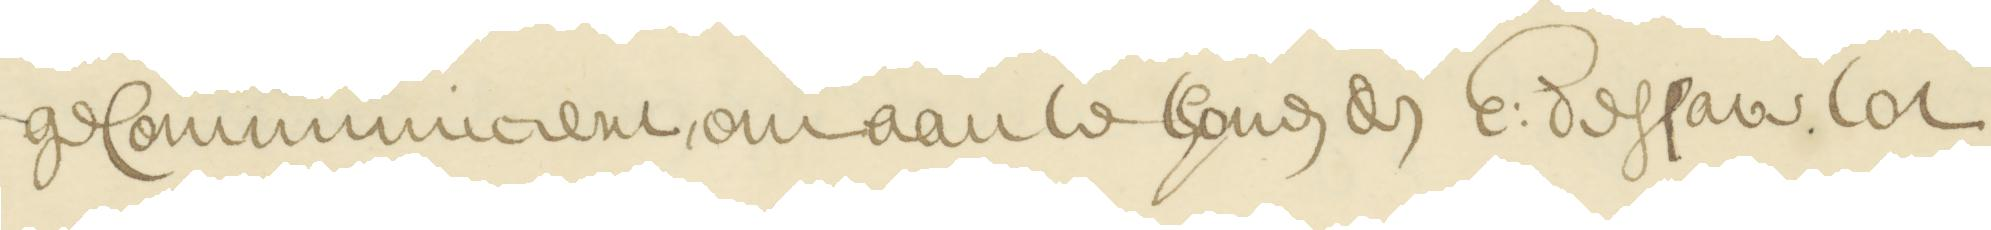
gecommunicert, om aan te thonen den E: dessave, tot
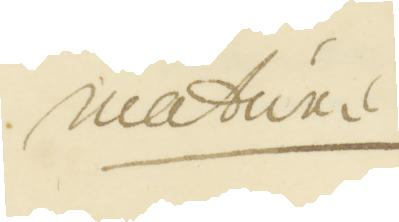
mature
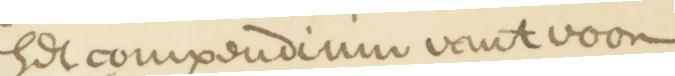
het compendium van’t voor
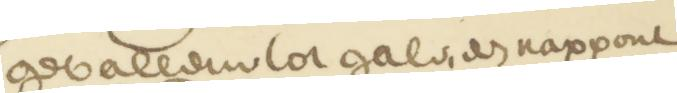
gevallene tot gale, een rapport
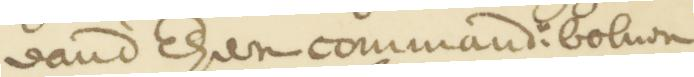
vand’ Eheer command.r bolner
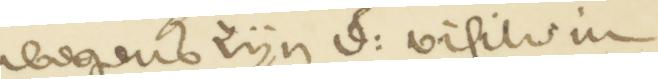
wegens zijn E: visite in
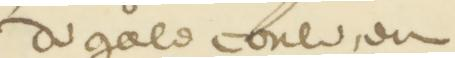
de gale corle, en
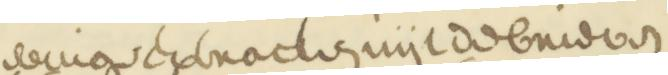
eenige Extracten uijt debrieven
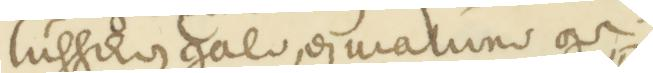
tusschen gale, en mature ge„
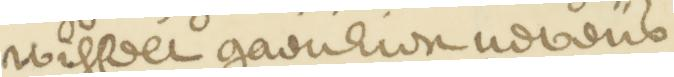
wisselt gaenhier nevens
